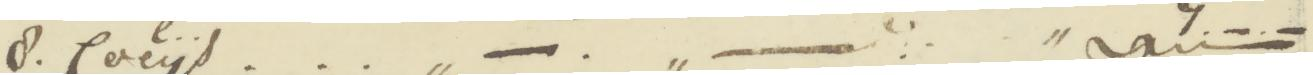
8. Coelijs . . . „ — . „ _:o - - „ 7.–.–
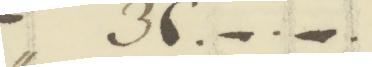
„ 35.–.–.
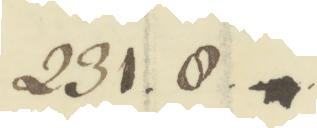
231. 8
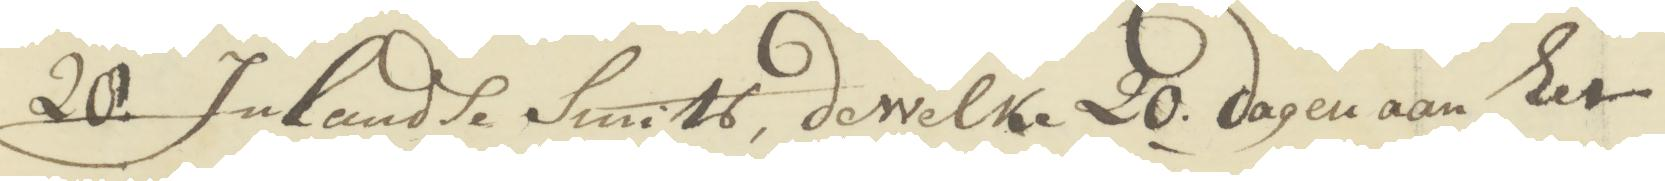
28 Jnlandse smits, dewelke 20. dagen aan het
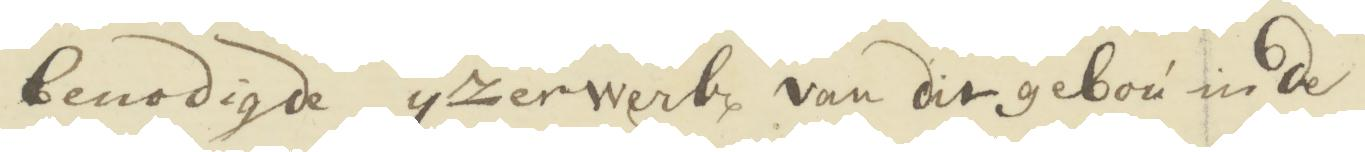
benodigde ijzerwerk van dit gebou in de
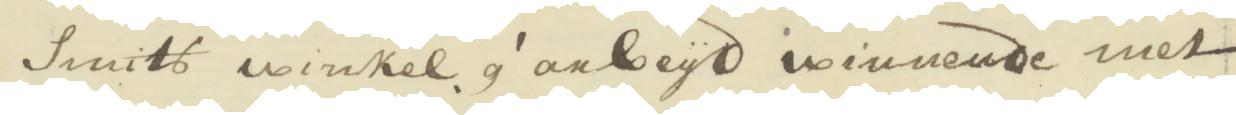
Smits winkel g’arbeijd winnende met
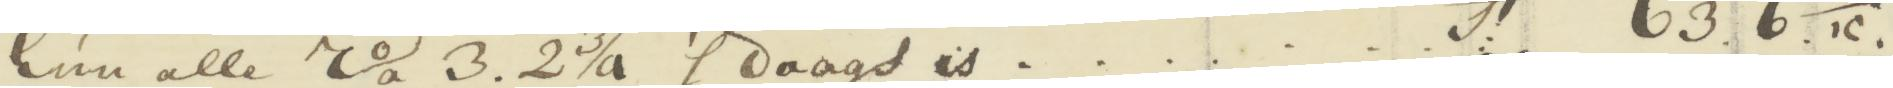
hun alle ro/a 3. 2¾ 's daags is . . . . . . . s:t 63.6.14/15.
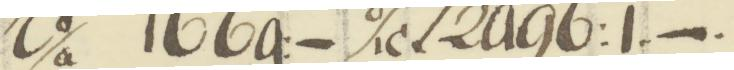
ro/a 1664:– 8/15. ƒ2496:1.–.
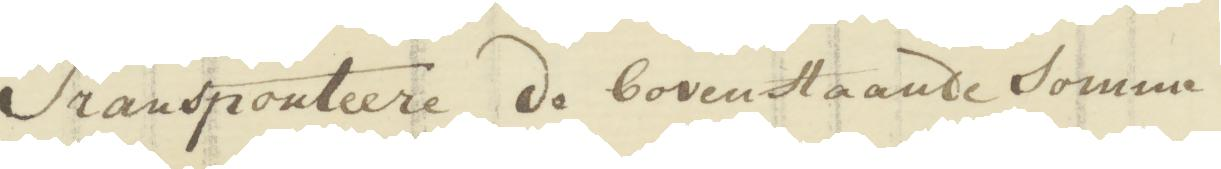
Transporteere de bovenstaande somma
